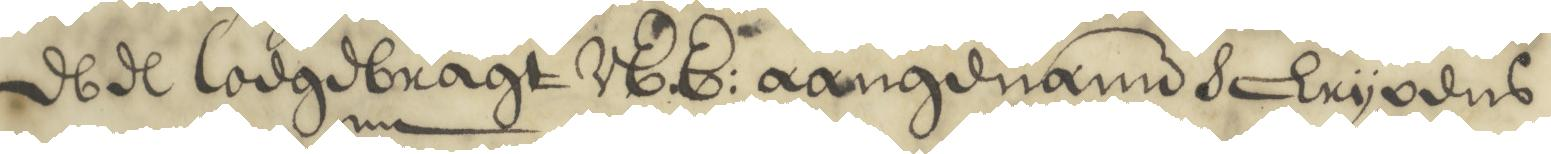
wel toegebragt VE.E: aangename schrijvens
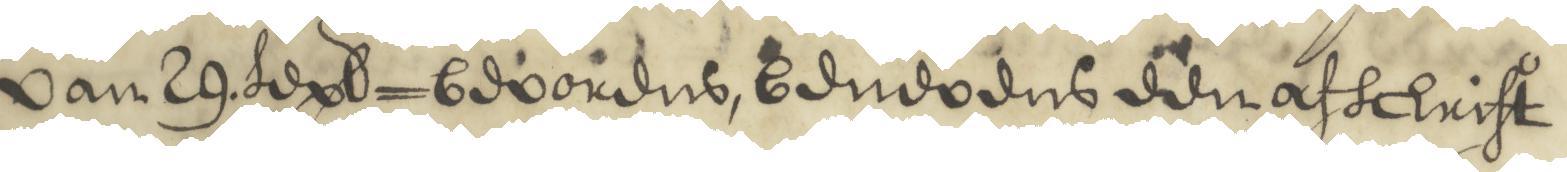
van 29. sept= bevorens, benevens een afschrift
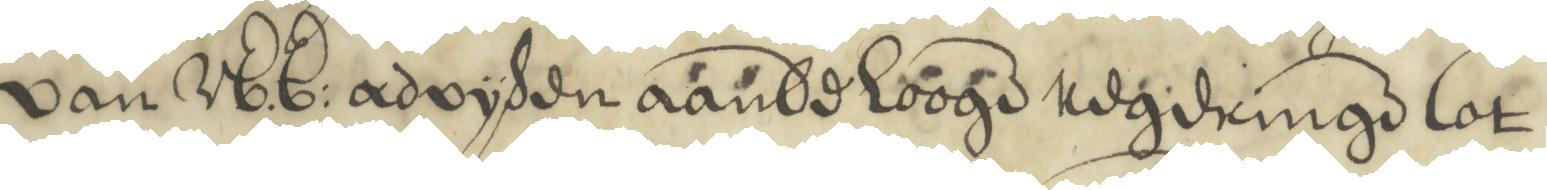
van VE.E: advijsen aande hooge regeringe tot
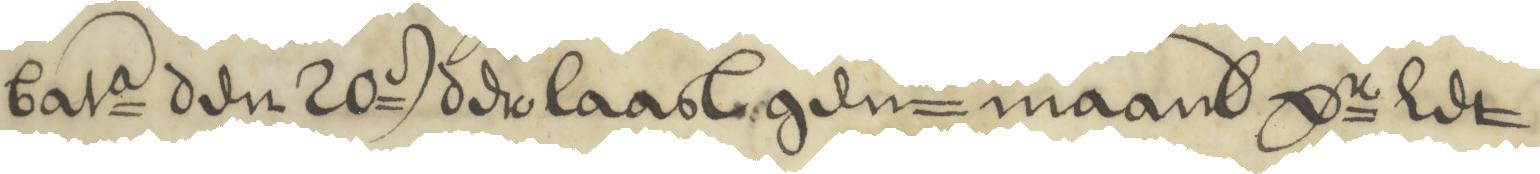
bat=a den 20=en der laast gen=de maand p=r het
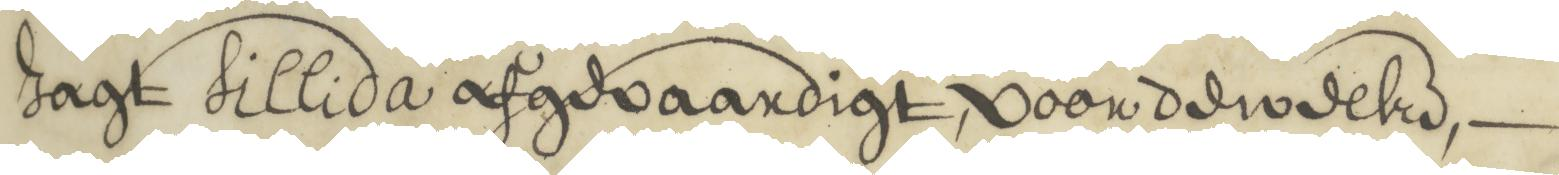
Jagt sillida afgevaardigt, voor dewelke, —
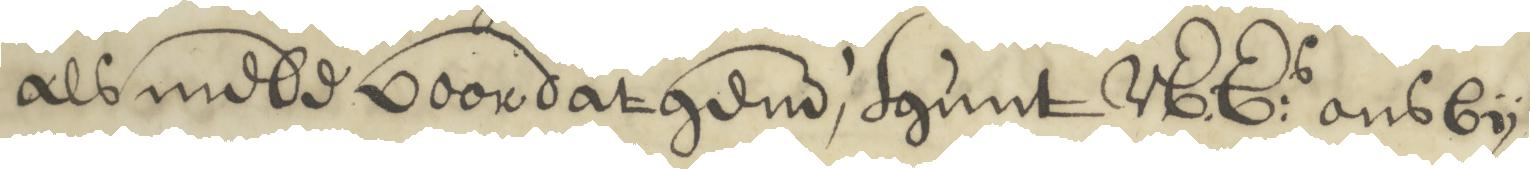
als mede voor dat gene, 'tgunt VE.E:s ons bij
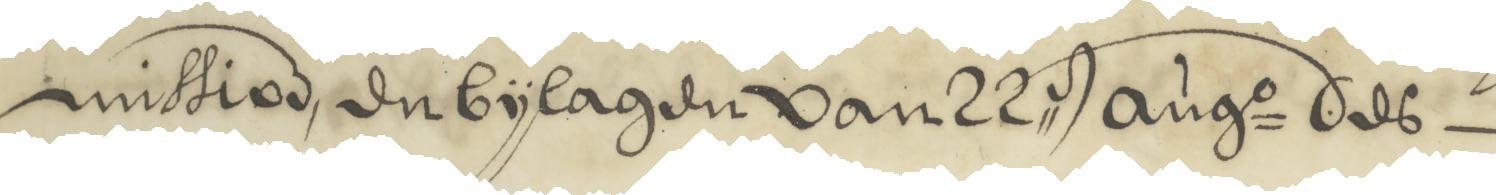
missive, en bijlagen van 22„en aug=o des —
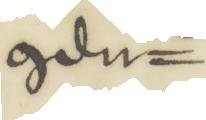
gen=de
